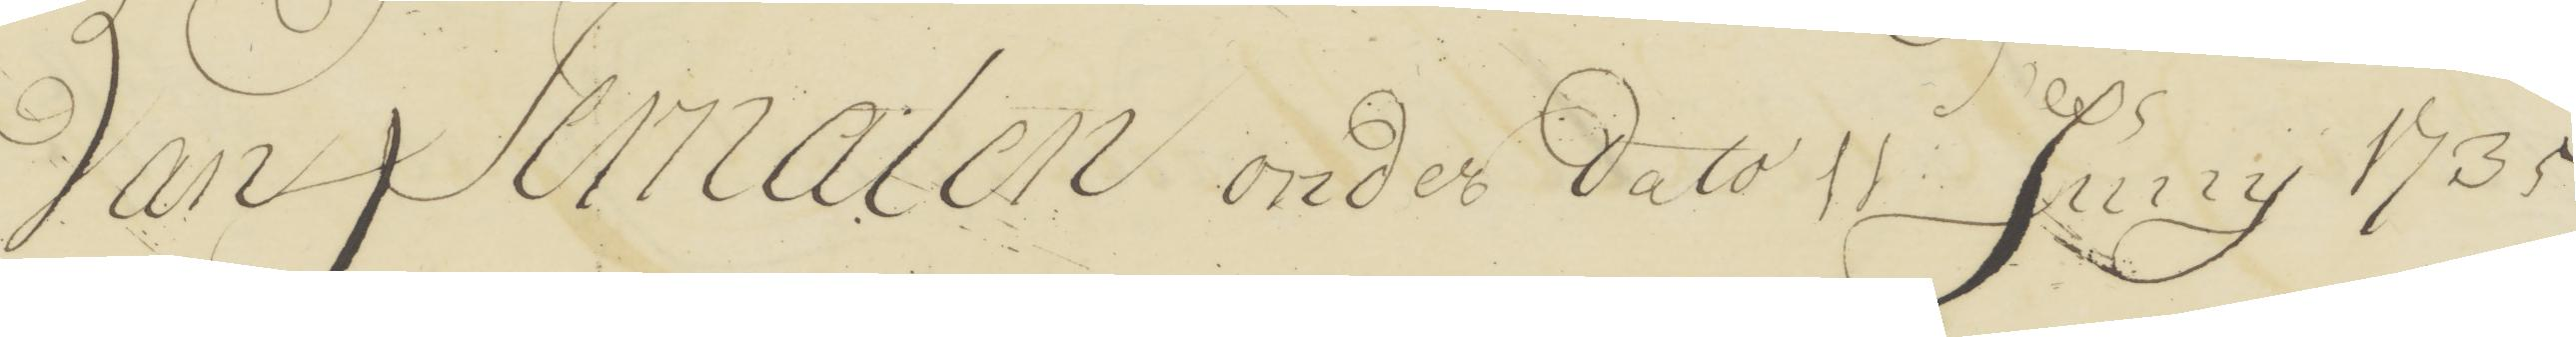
Van Ternaten onder dato 11:' Junij 1735
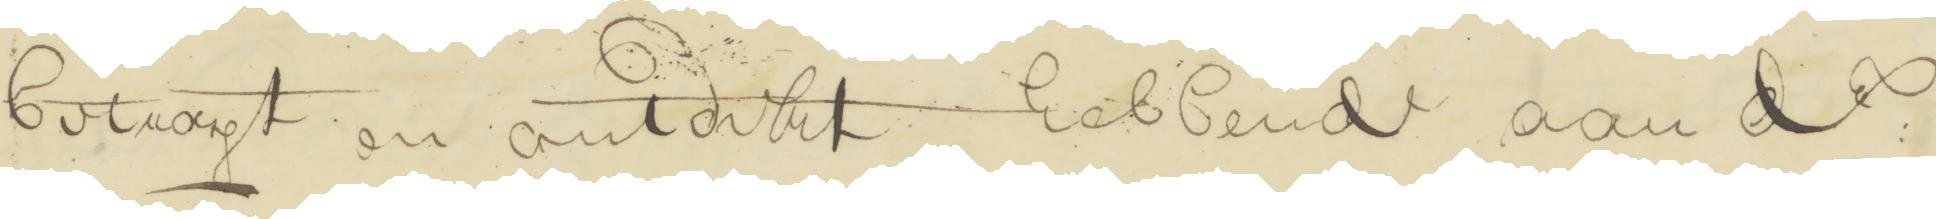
betrapt en ontdekt hebbende aan dE:
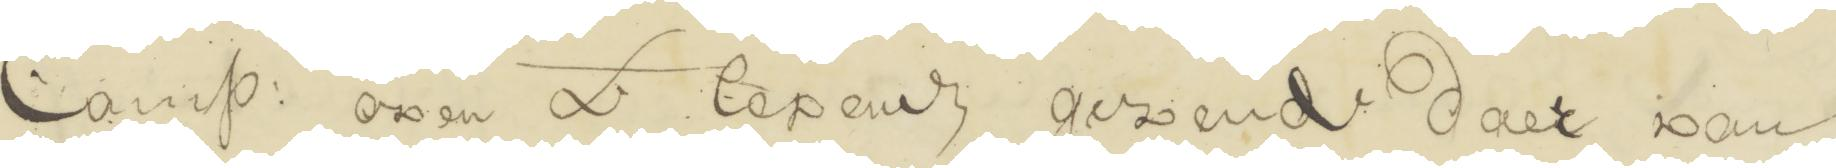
Comp: over te leveren gevende daer van
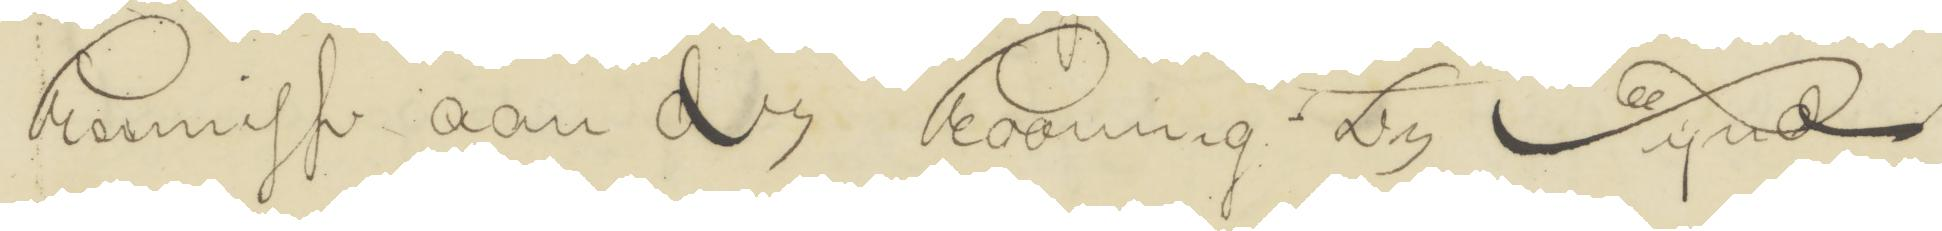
kennisse aan den kooning ten Eijnde
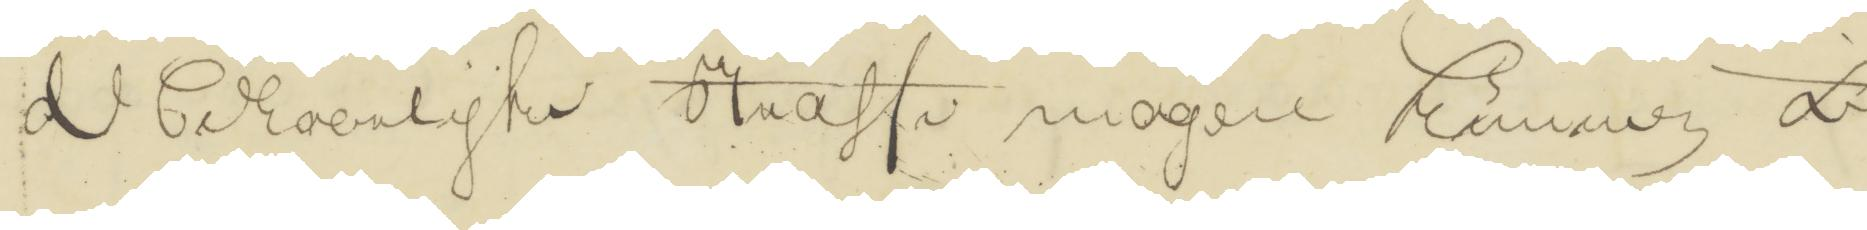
de behoorlijke straffe mogen kunnen te
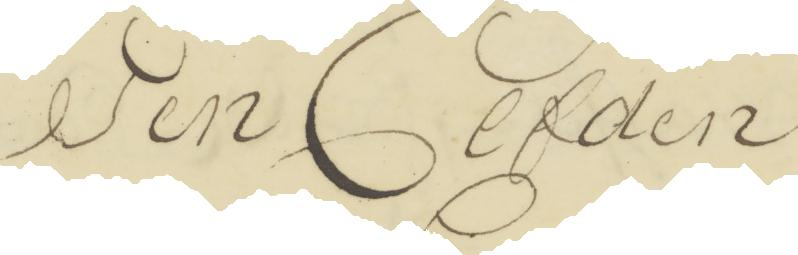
Ten Elfden
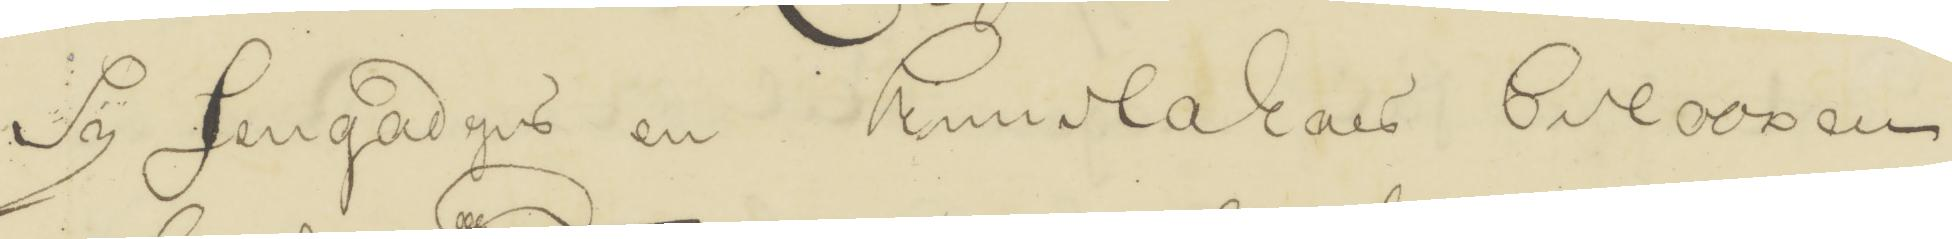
Sij Sengadjes en kimelahaes belooven
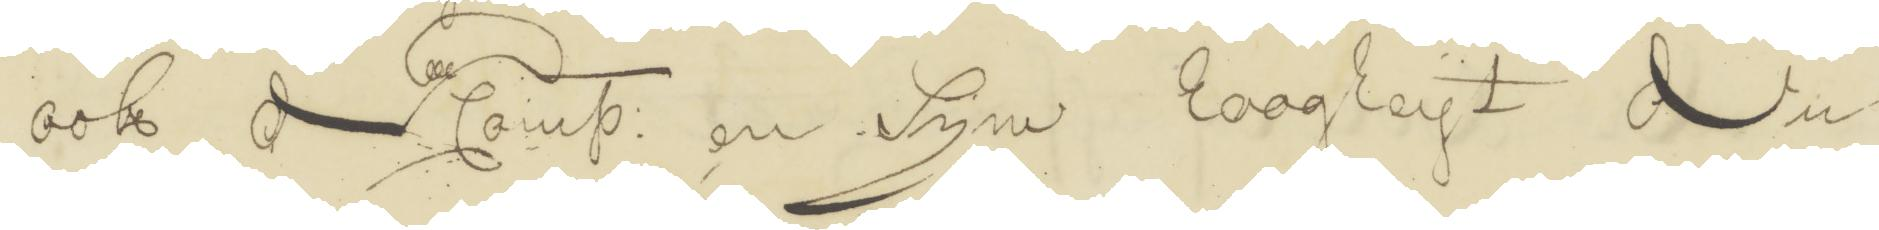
ook d E Comp: en sijne hoogheijt den
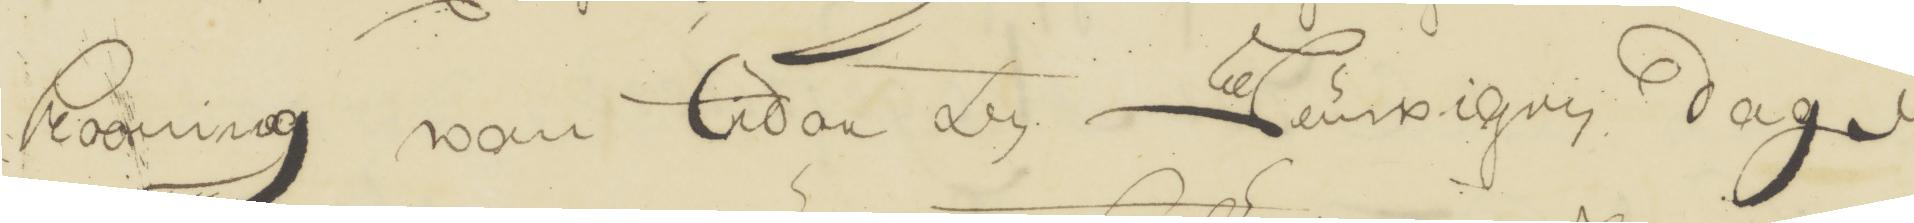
kooning van tidor ten Eeuwigen dage
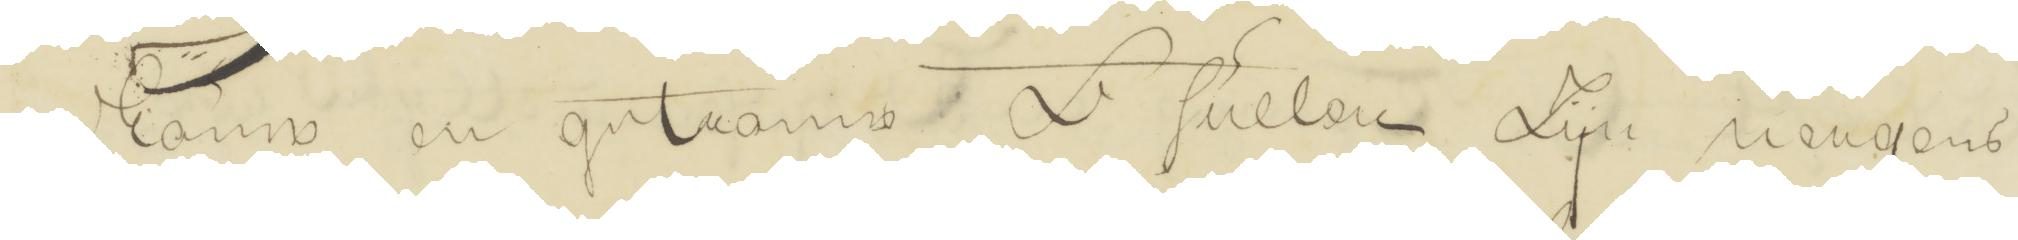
gehouw en getrouw te sullen zijn nergens
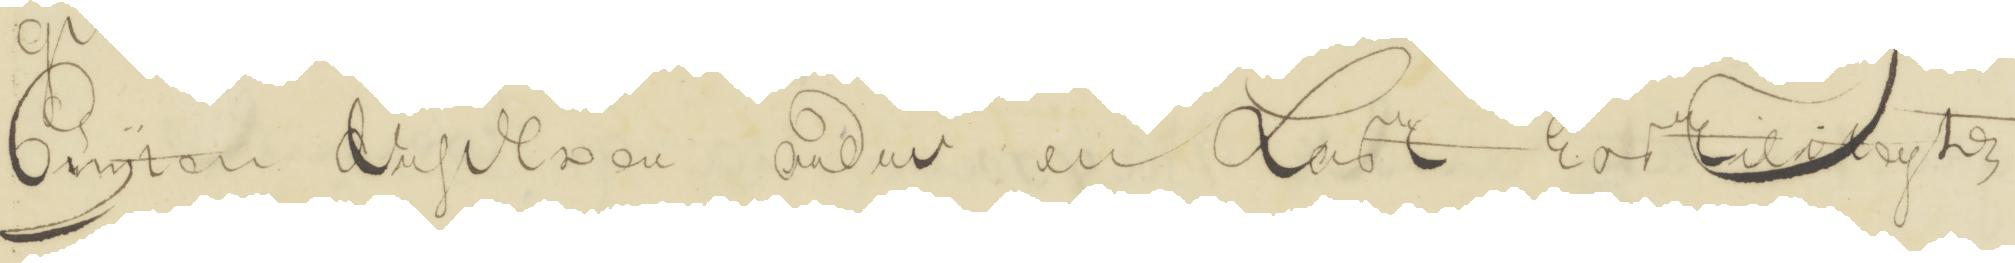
buijten derselven ordre en Last hostiliteyten
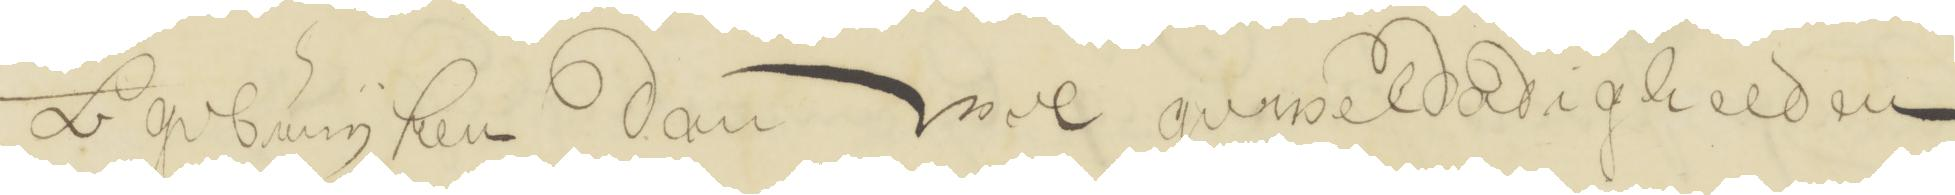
te gebruijken dan wel geweldadigheeden
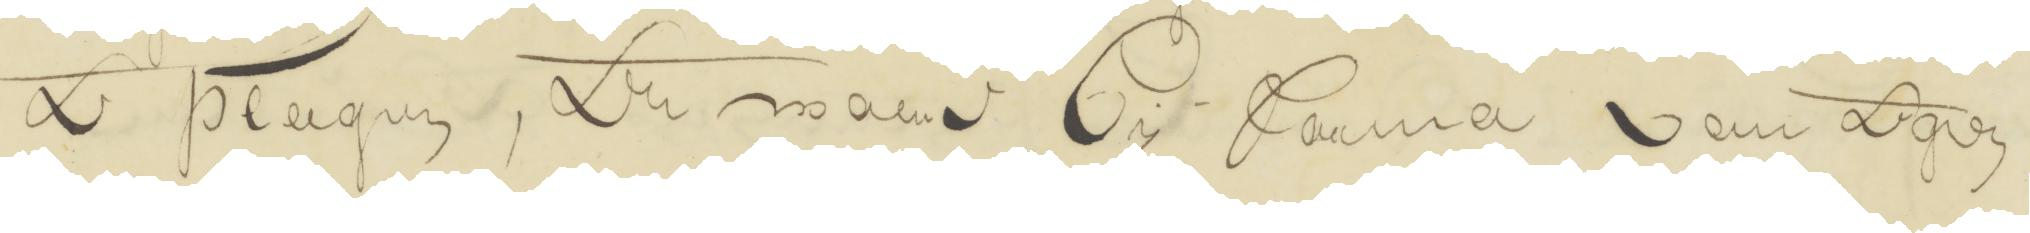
te pleegen, ten waere bij forma van tegen
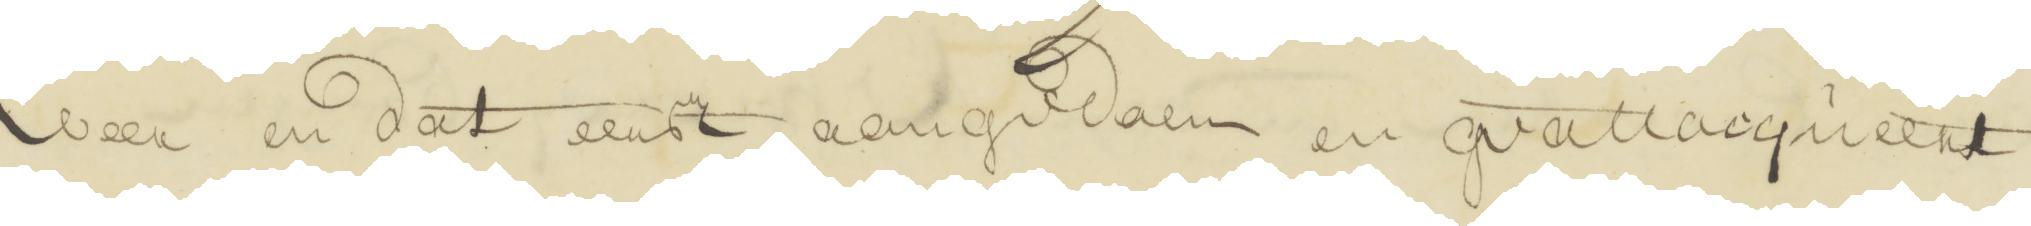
weer en dat eerst aangedaen en geattacqueert
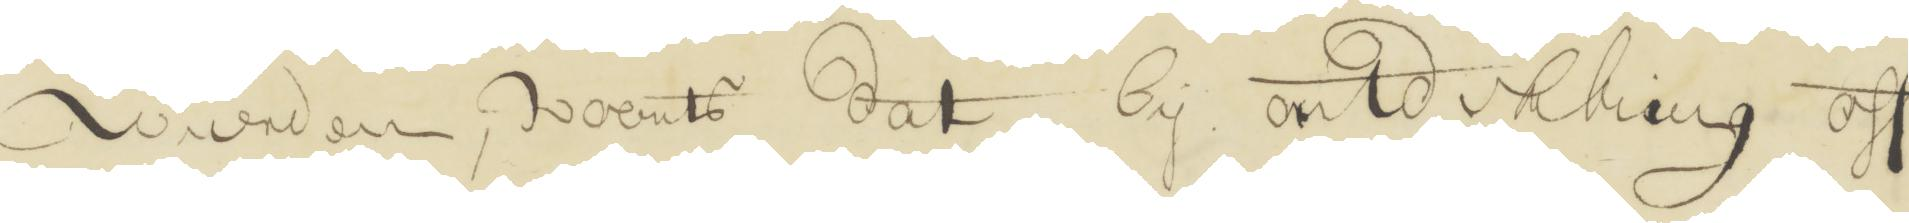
wierden, voorts dat bij ontdekking off
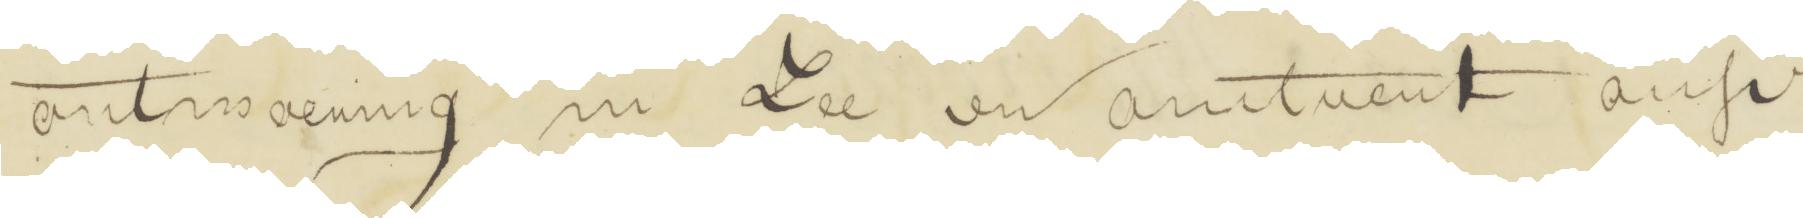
ontwoering in zee en omtrent onse
